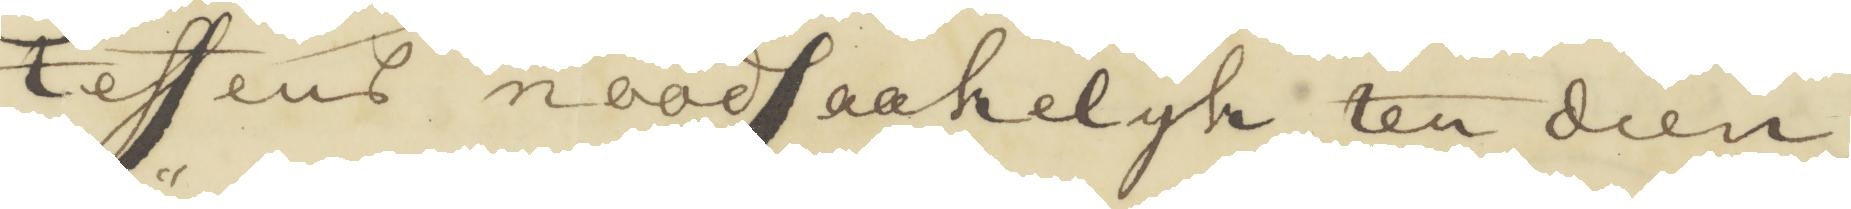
teffens noodsaakelijk, ten dien
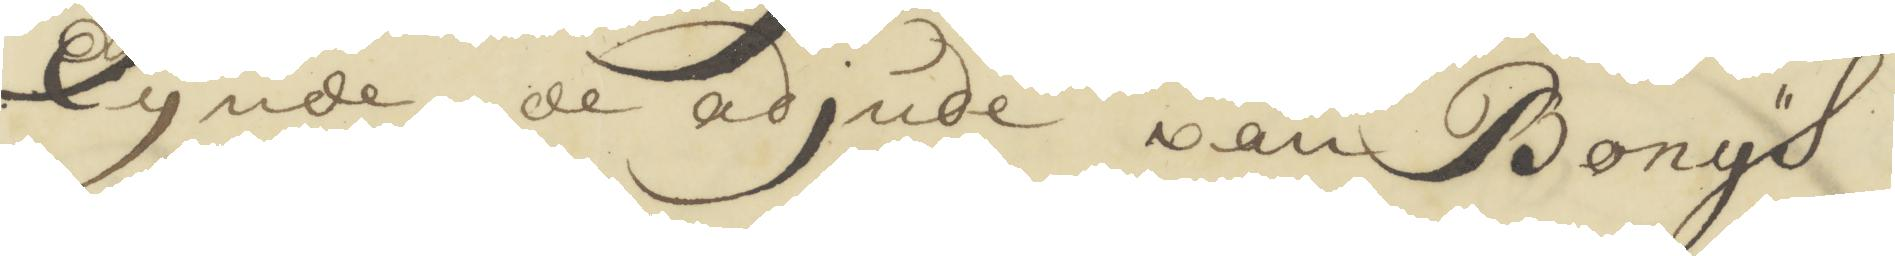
Eijnde de adjude van Bonijs
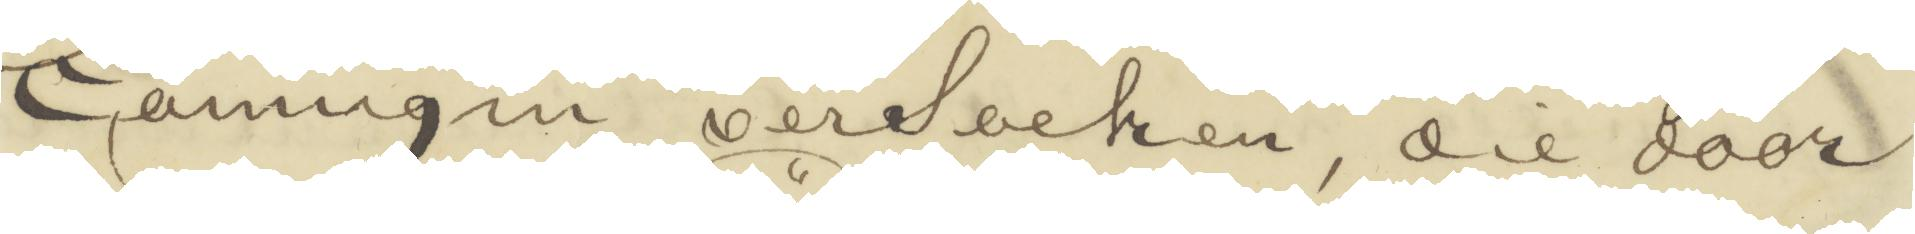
coningin versoeken, die door
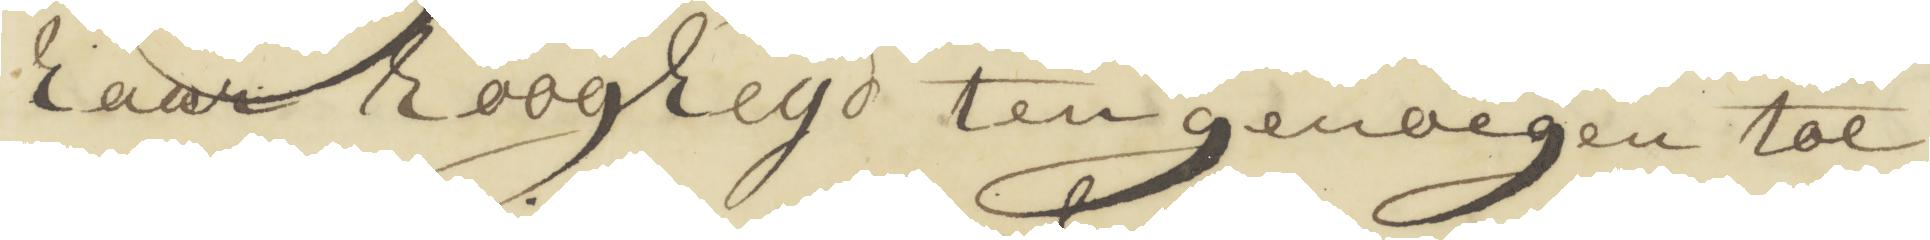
haar hoogheijd ten genoegen toe
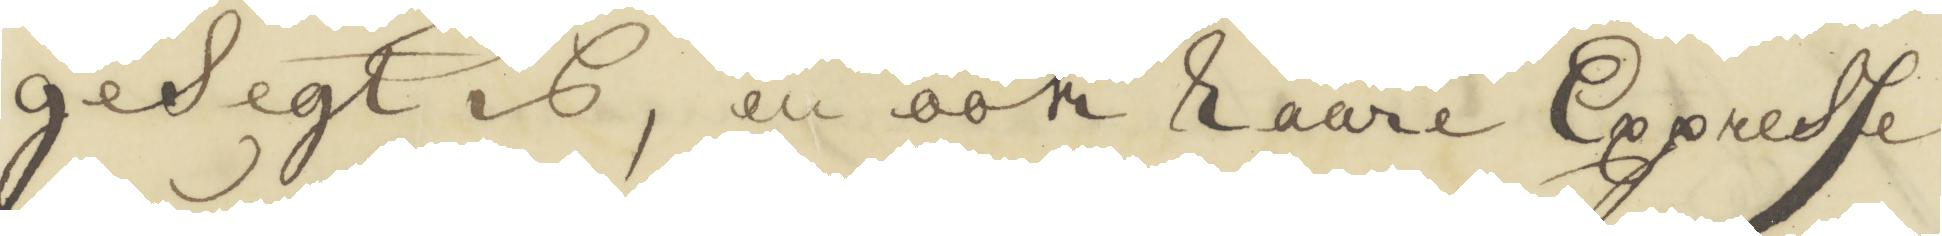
gesegt is, en ook haare Expresse
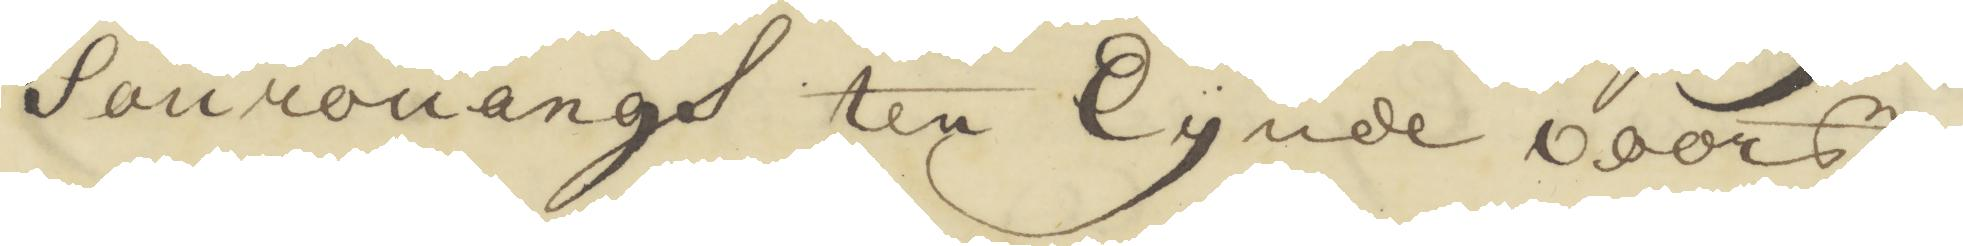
sourouangs ter Eijnde voorsz:
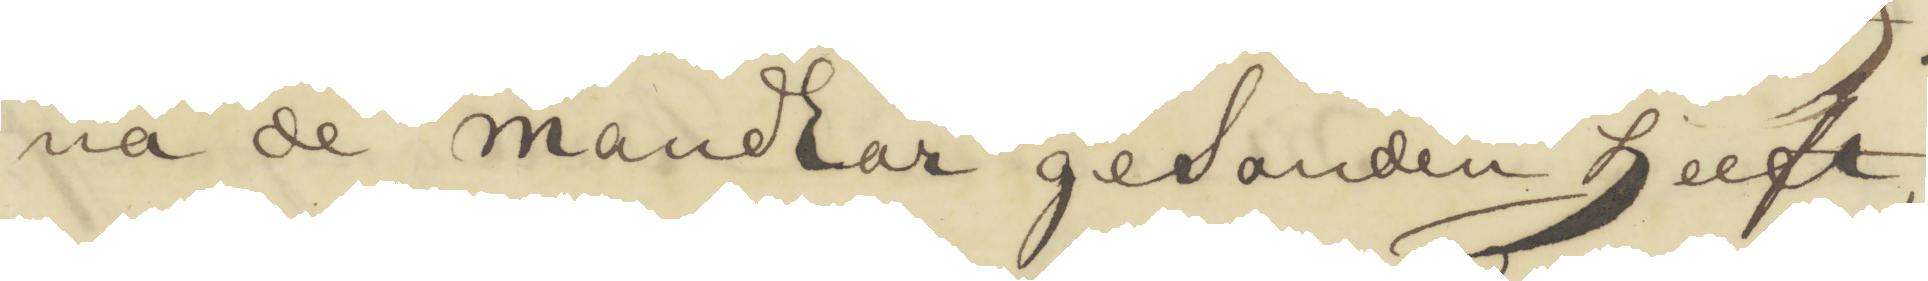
na de mandhar gesonden heeft,
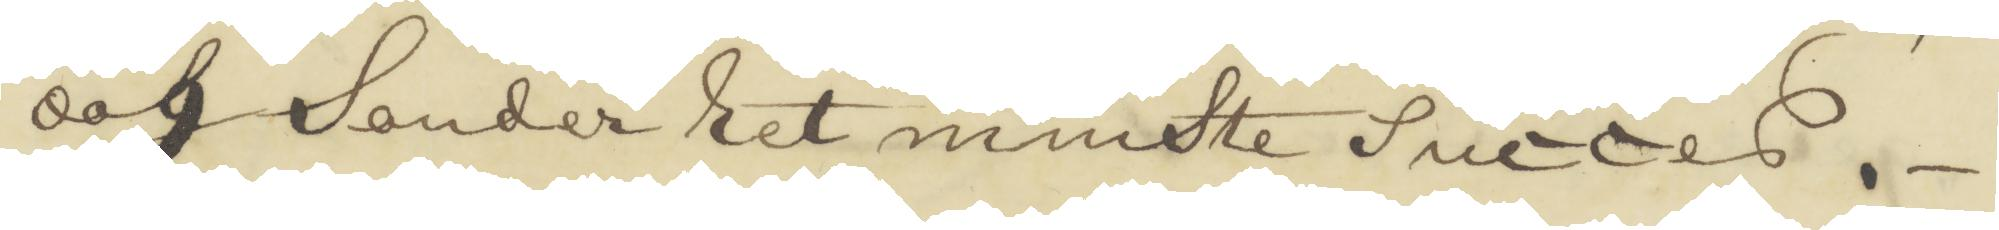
dag sonder het minste succes. —
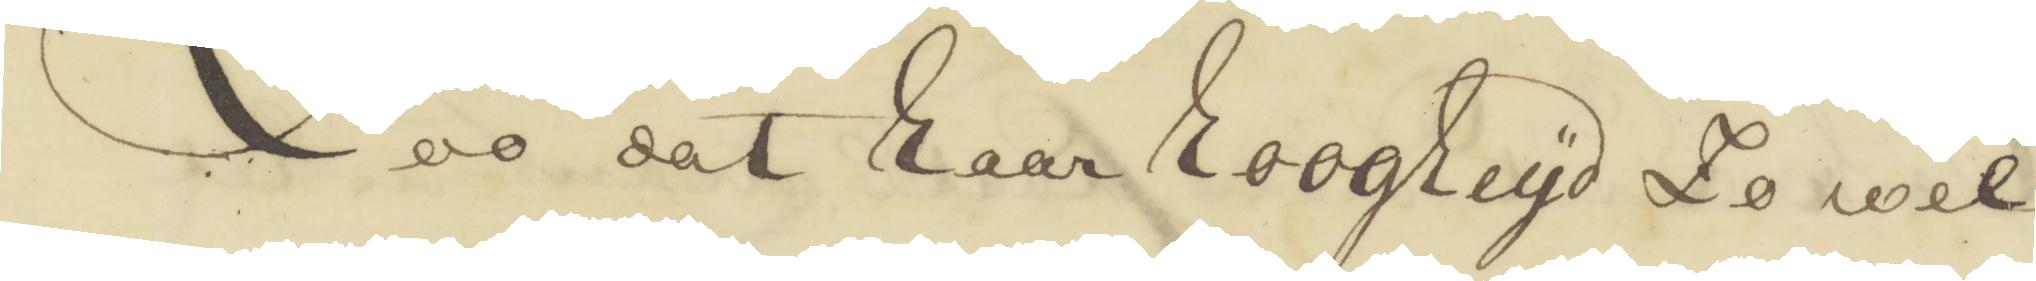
Zoo dat haar hoogheijd zo wel
